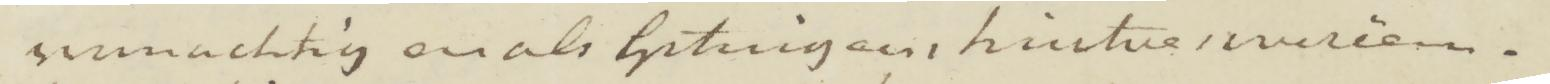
woonachtig en als Getuigen hiertoe overeen-
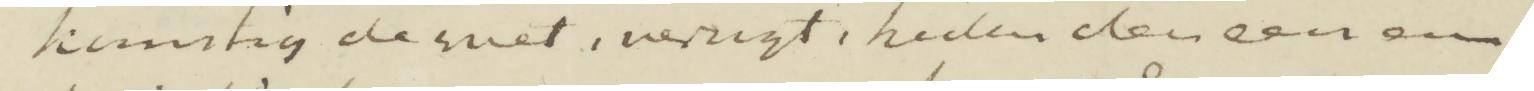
komstig de wet, verzogt, heden den een en
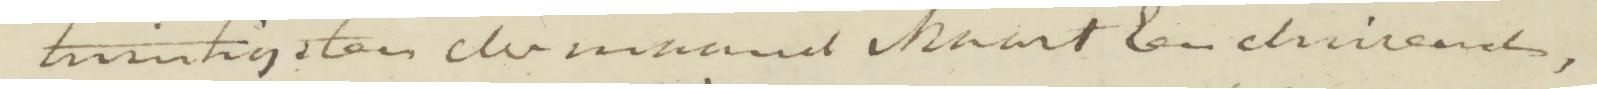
twintigsten der maand Maart Een duizend,
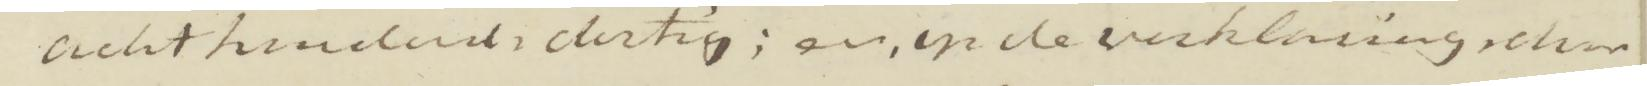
acht honderd dertig; en, op de verklaring, door
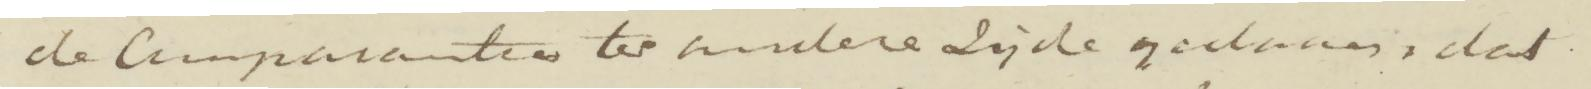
de Comparanten ter andere zijde gedaan dat
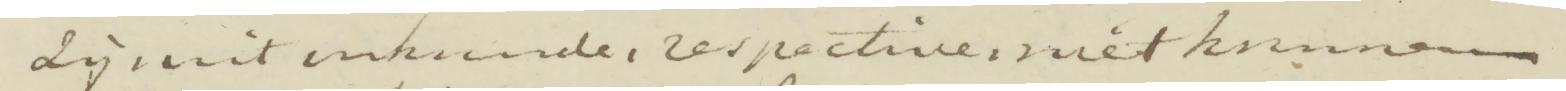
zij uit onkunde, respective niet kunnen
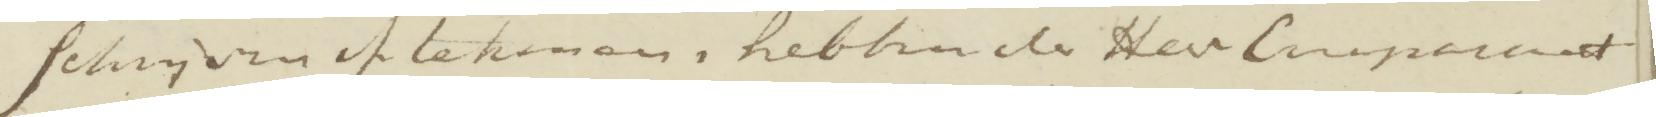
Schrijven of tekenen, hebbende Heer Comparant
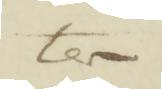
ter
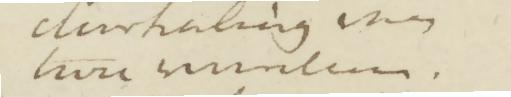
twee worden.
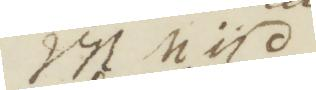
VR nijd
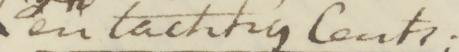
¶en tachtig Cents;
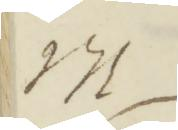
VH
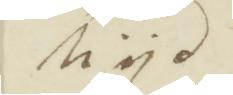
Nijd
